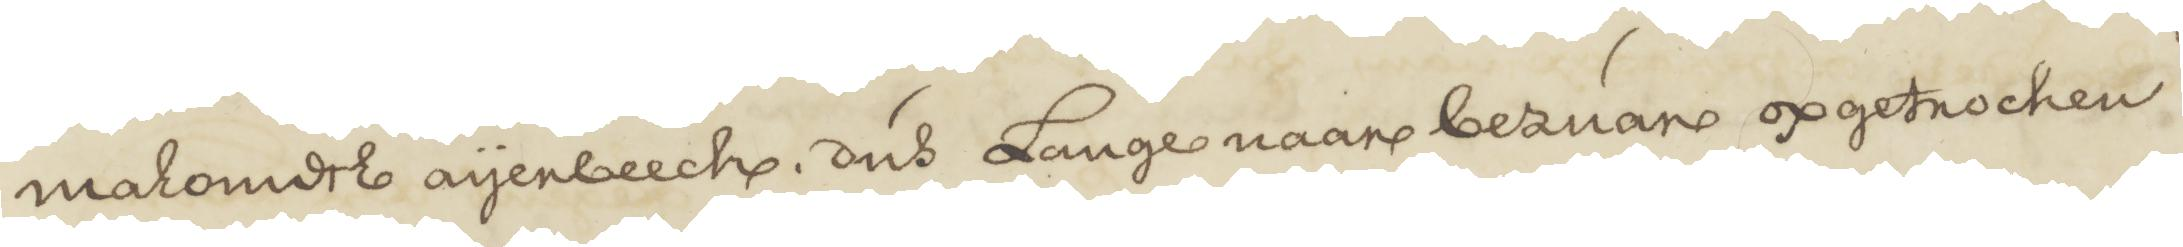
mahometh aijerbeeck, dus Lange naar bezuar op getrocken
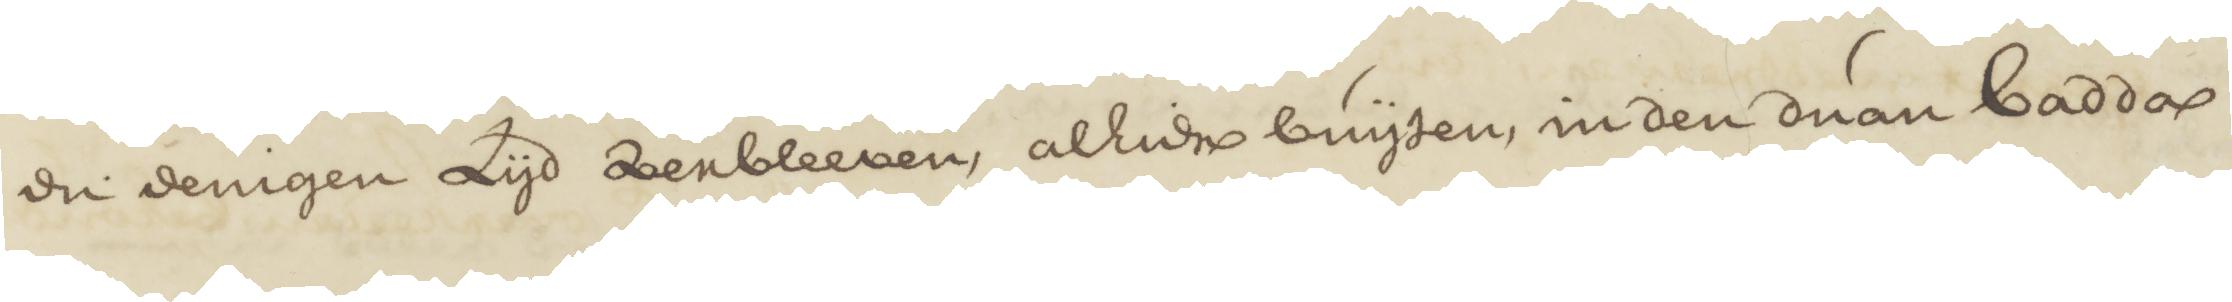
en eenigen tijd verbleeven, alhier buijten, in den duan badda
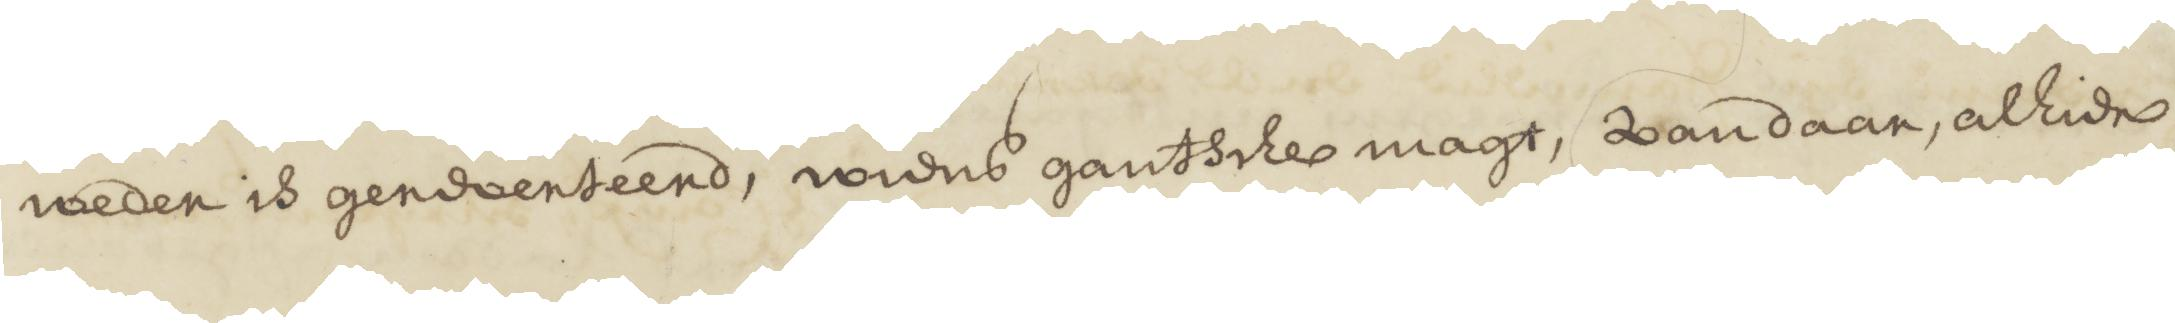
weder is gereverteerd, wiens gantsche magt, van daar, alhier
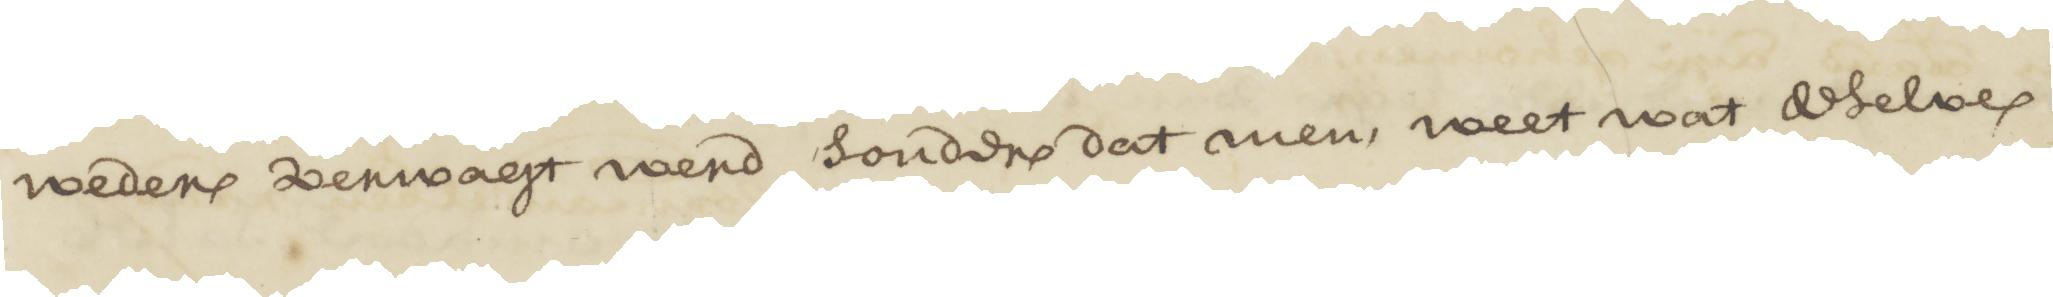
weder verwagt werd sonder dat men, weet wat deselve
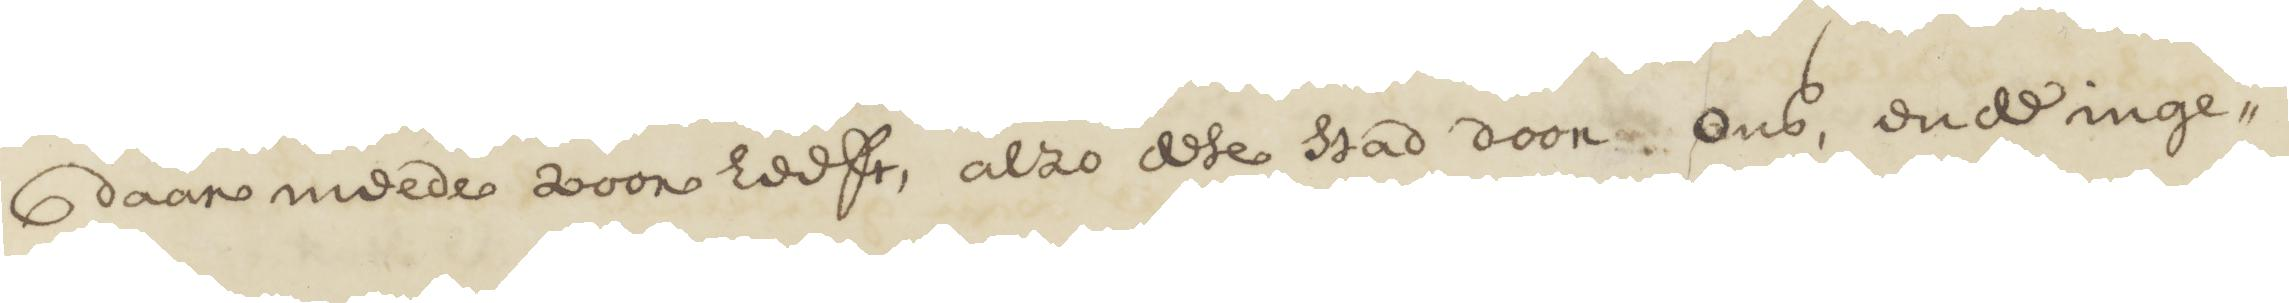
daar meede voor heeft, alzo dese stad door ons, en de inge„
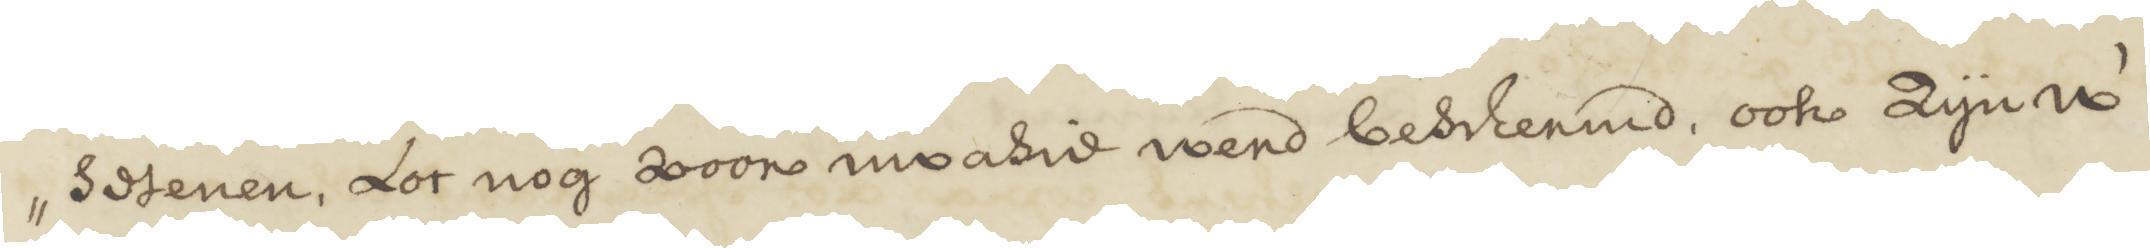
„setenen, tot nog voor invasie werd beschermd, ook Zijn w'
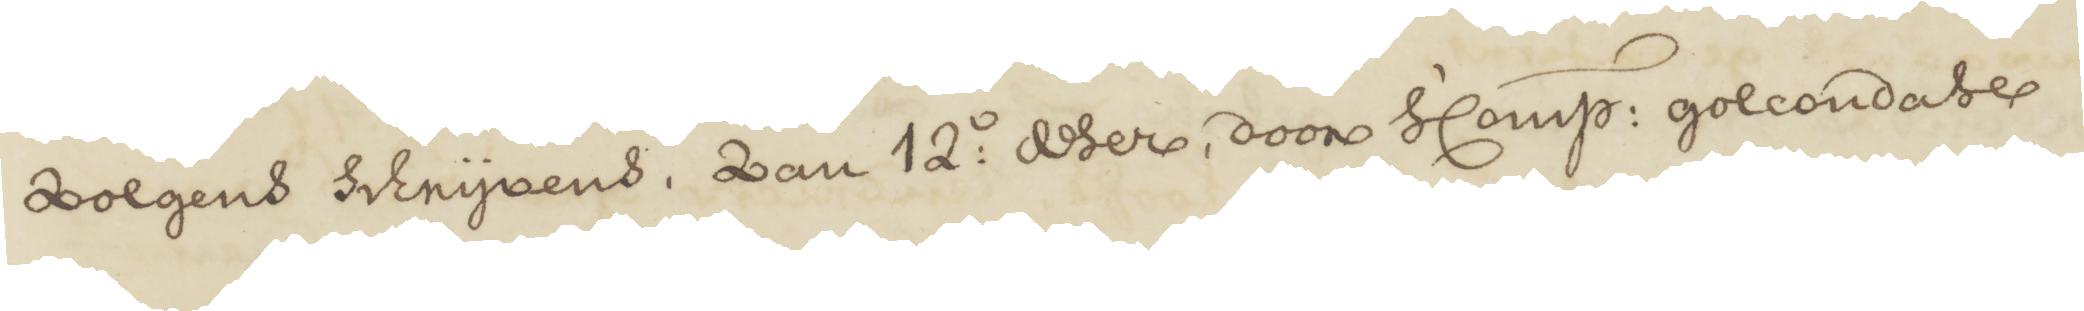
volgens Schrijvens, van 12:o deser, door ’sComp: golcondase
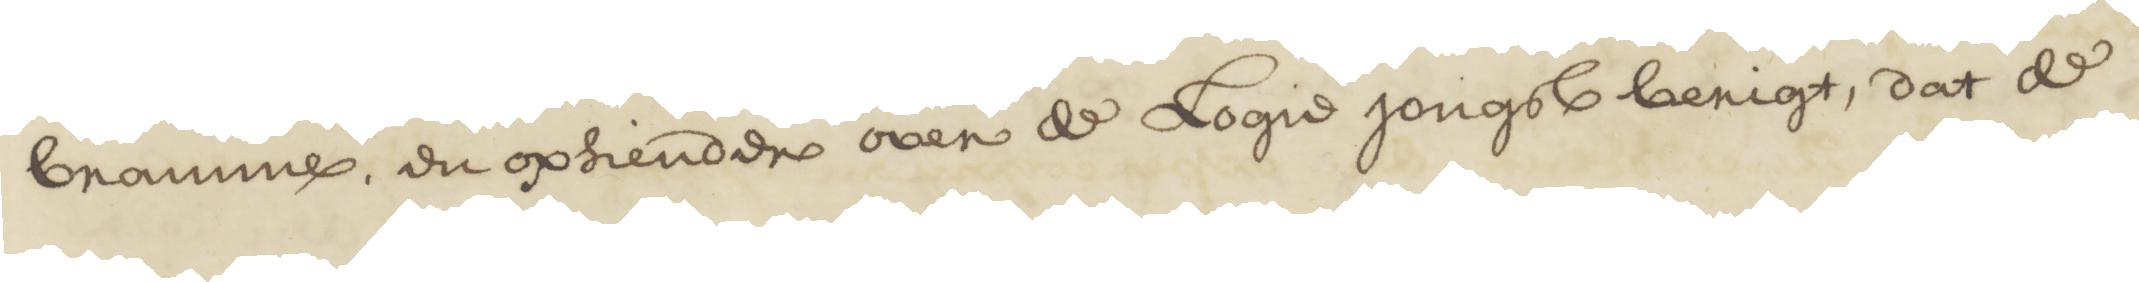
branuw, en op siender over de Logie jongst berigt, dat de
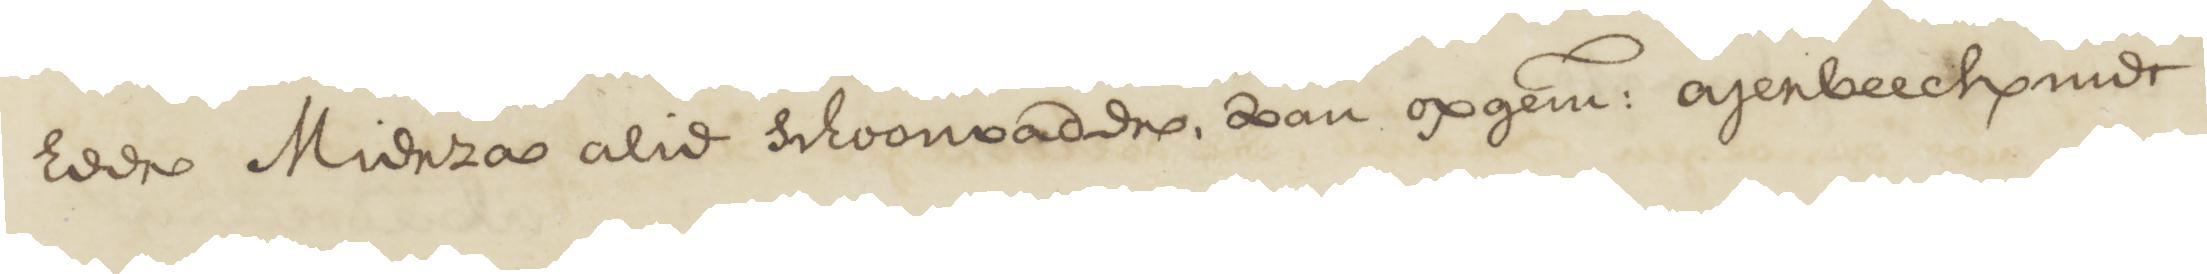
heer Mierza alie schoonvader, van op gem: ajerbeeck met
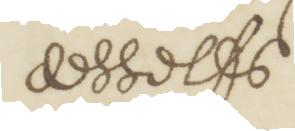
desselfs
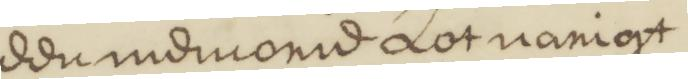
een memorie tot narigt
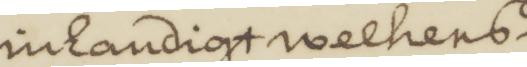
inhandigt welkers
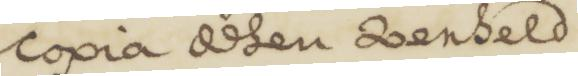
copia desen verseld
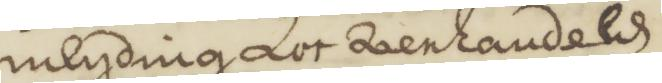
inlijding tot verhandelen
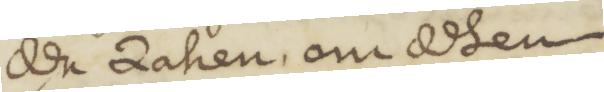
der zaken, om desen
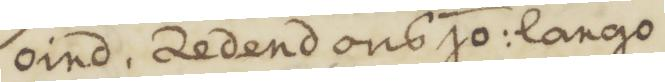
oird, zederd ons jo: largo
